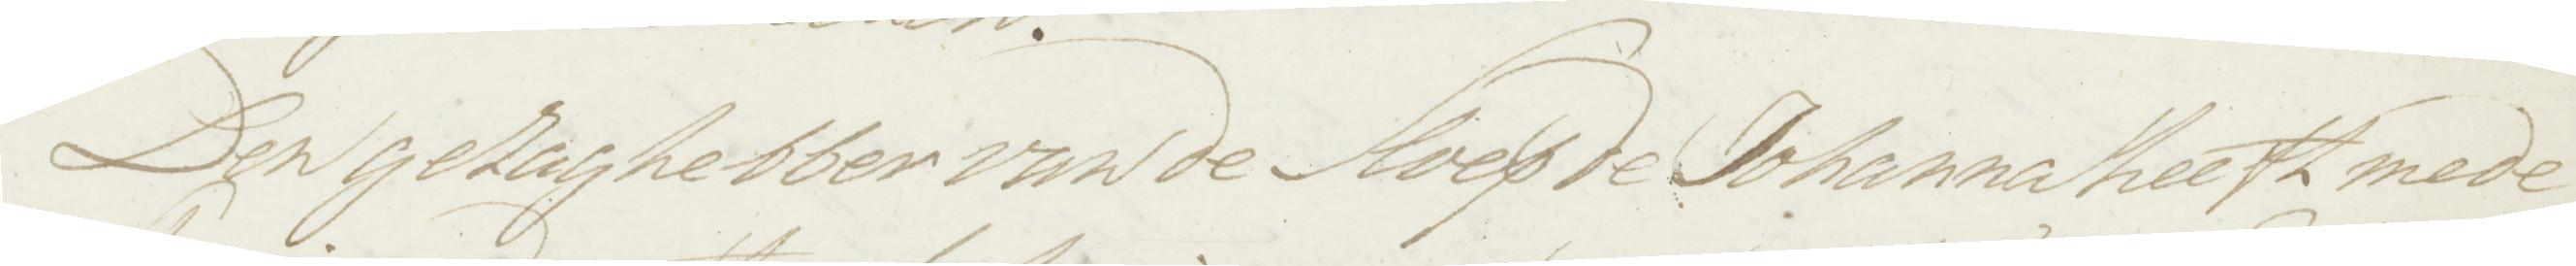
Den gezaghebber van de Sloep de Iohanna heeft mede
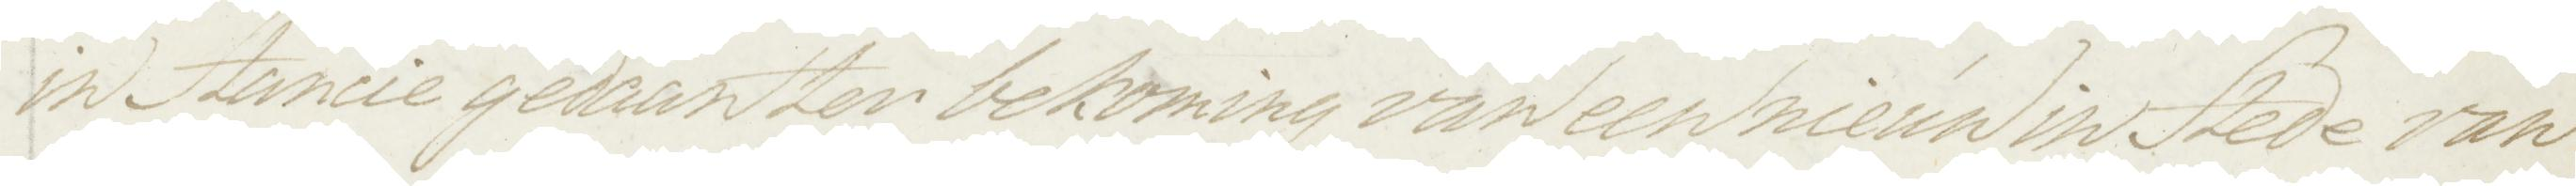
instancie gedaan ter bekoming van een nieuw in Stede van
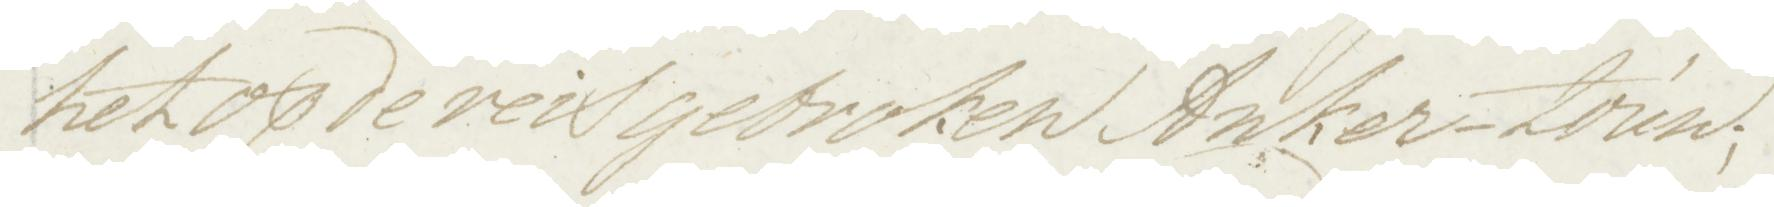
het op de reis gebroken Anker-touw;
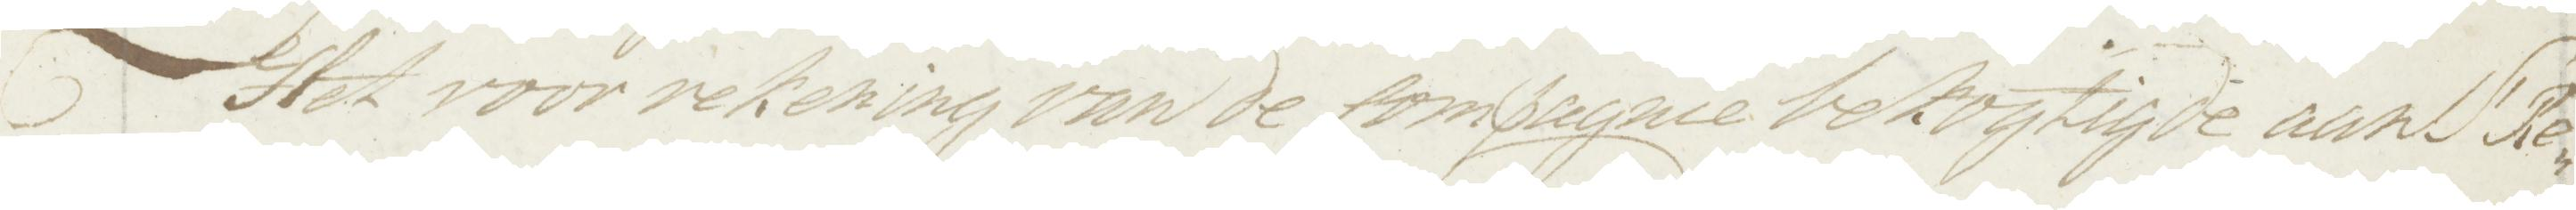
Het voor rekening van de Compagnie bekogtigde aan S' Re„
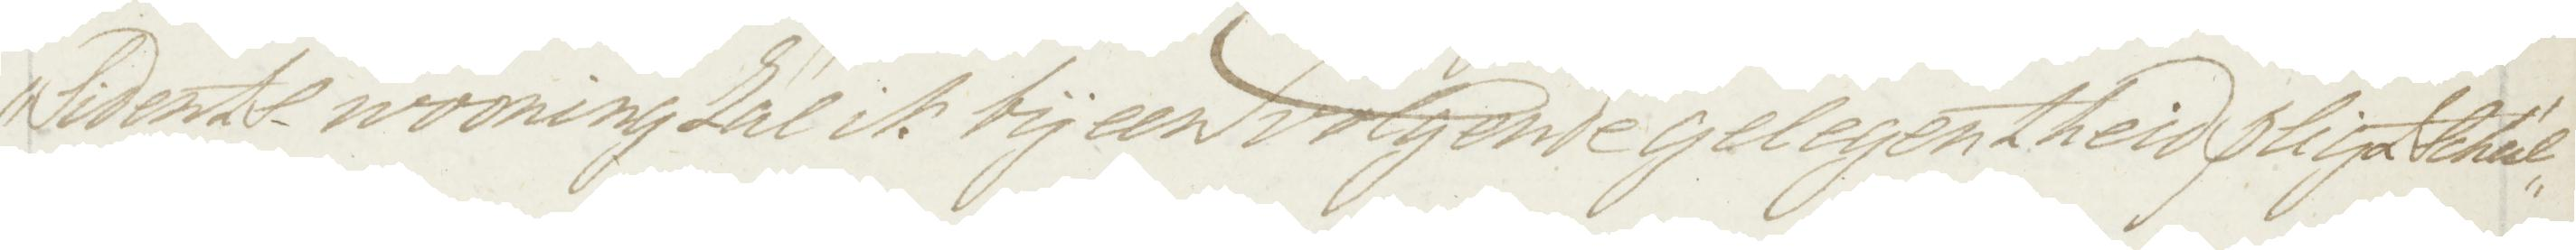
„sidents wooning Zal ik bij een volgende gelegentheid pligtschul„
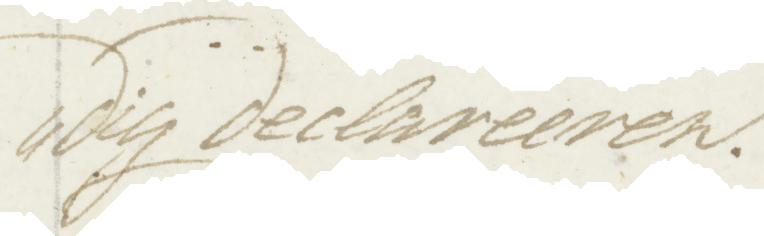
dig declareeren.
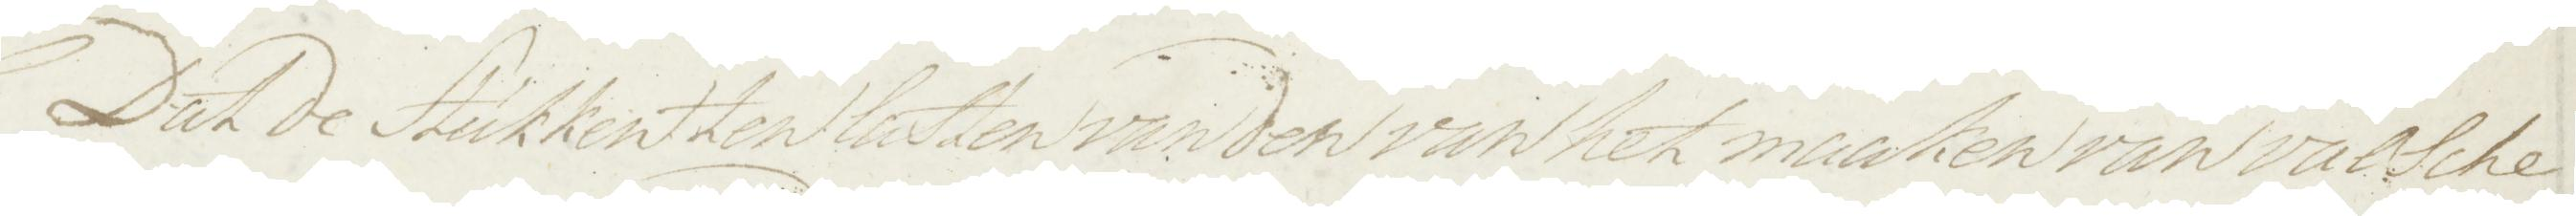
Dat de stukken ten lasten van den van het maaken van valsche
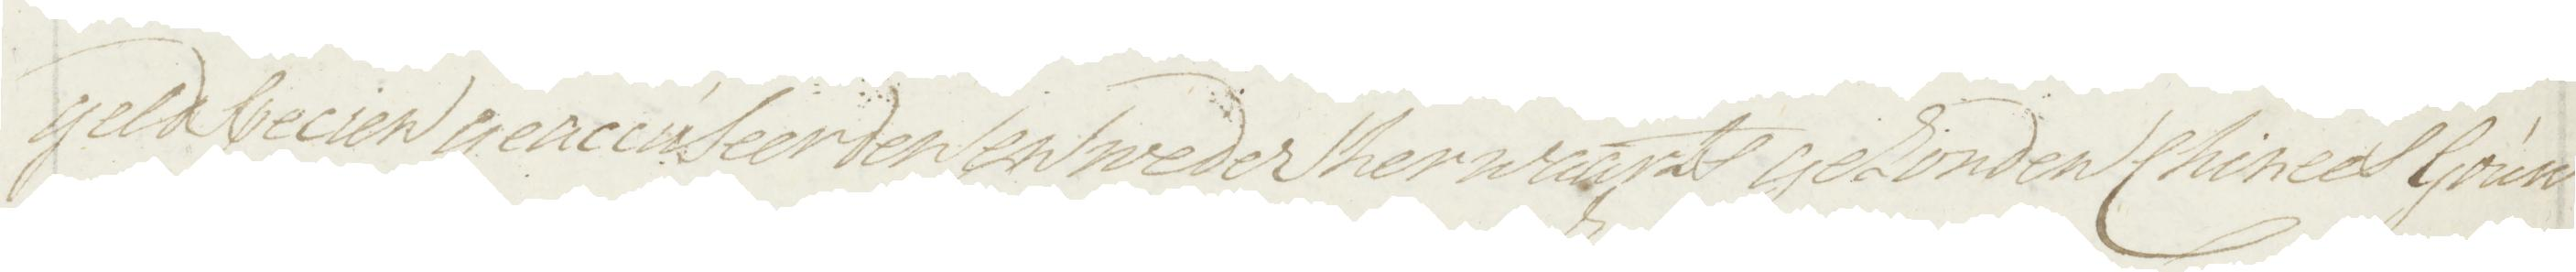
geldspecien geaccuseerden en weder herwaarts gezonden Chinees Gouw
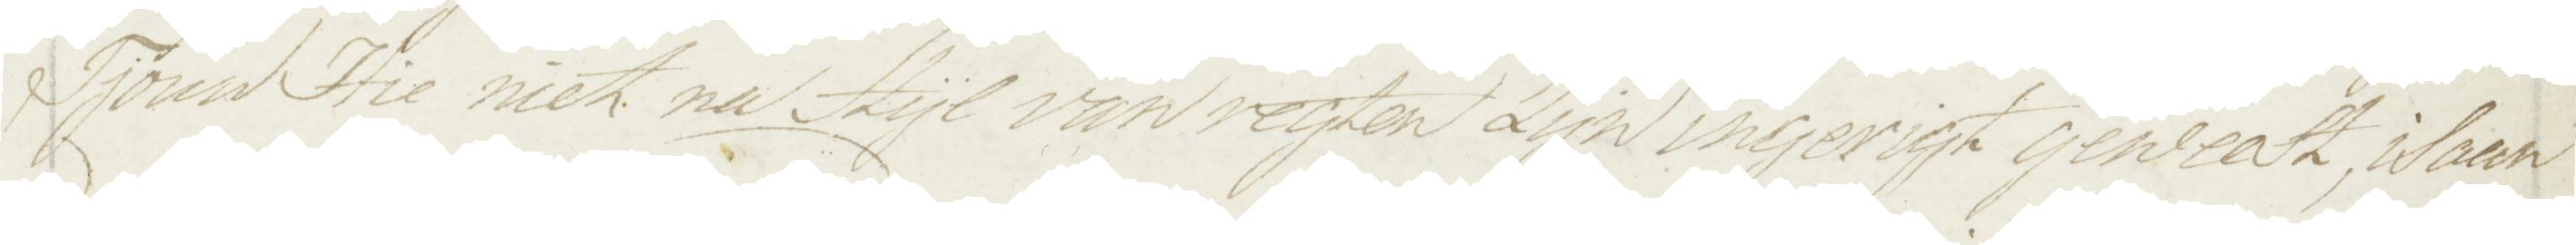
Tjouw Hie niet na Stijl van regten Zijn ingerigt geweest, is aan
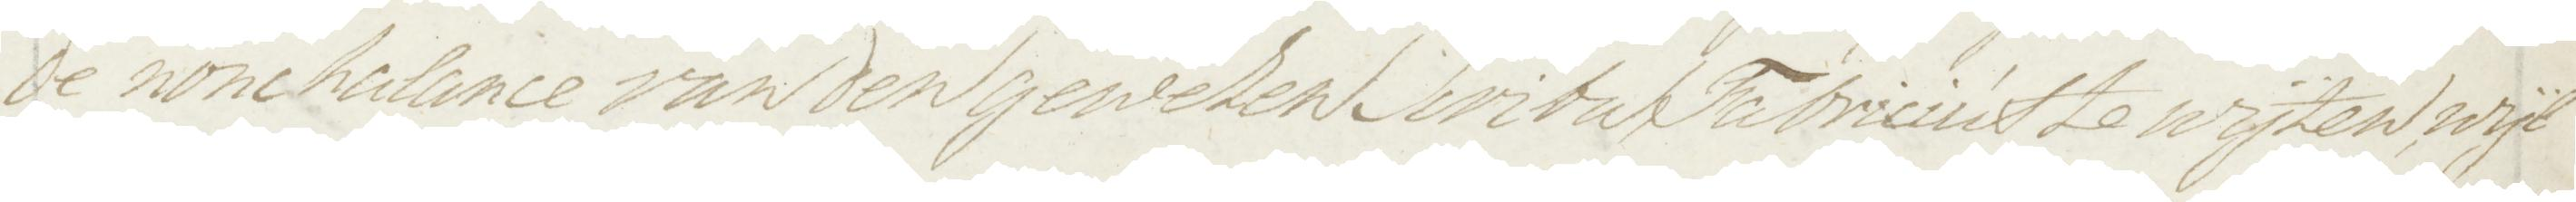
de nonchalance van den gewezen Scriba Fabricius te wijten, wijl
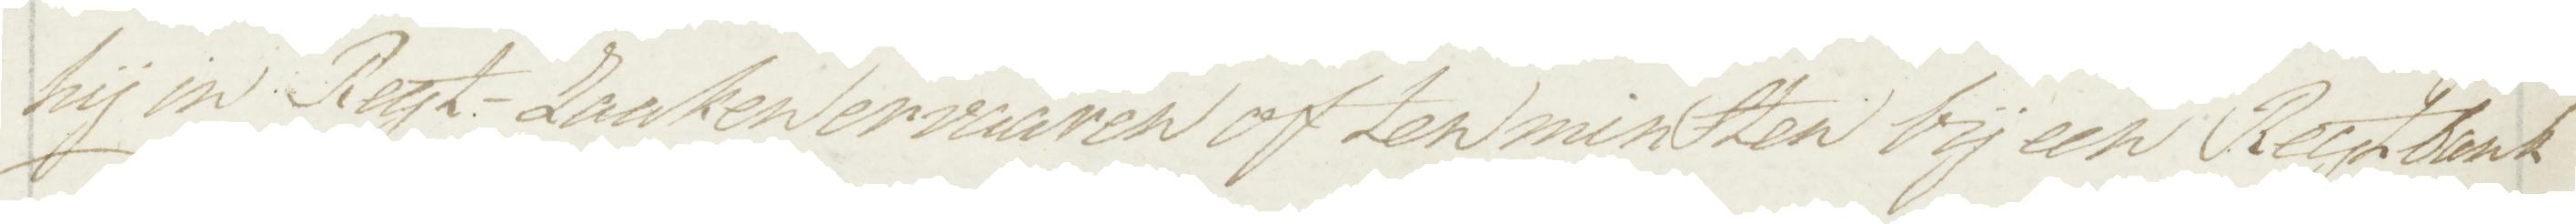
hij in Regt-Zaaken ervaaren of ten minsten bij een Regtbank
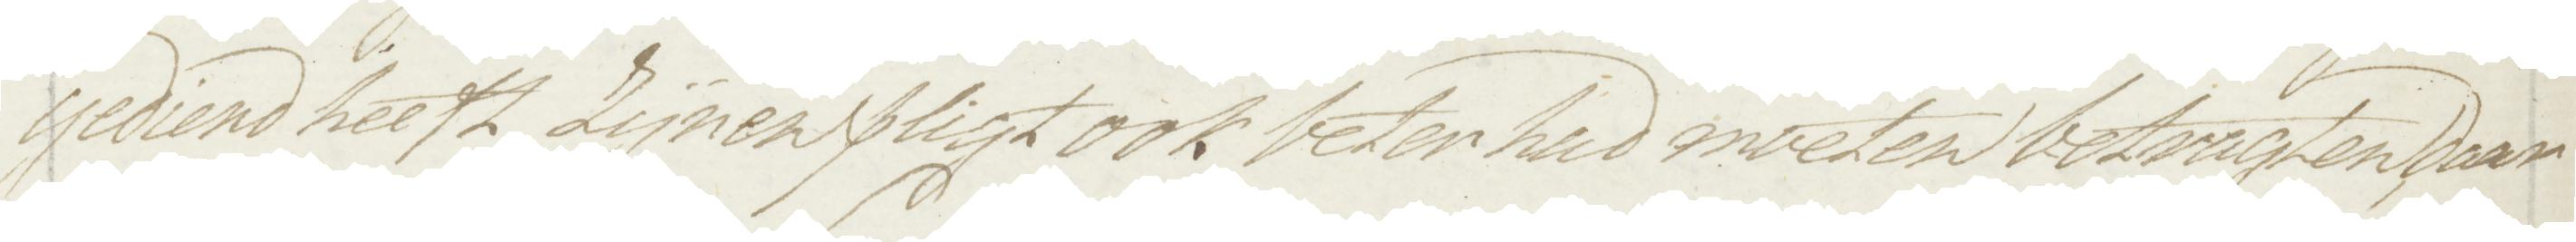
gediend heeft, Zijner pligt ook beter had moeten betragten daar
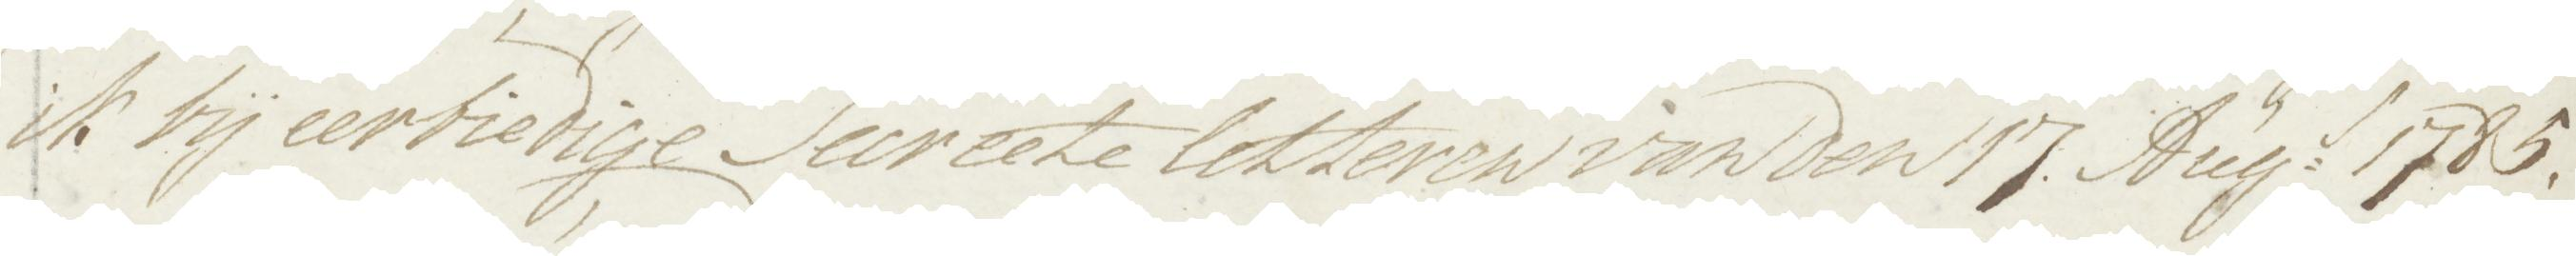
ik bij eerbiedige Secreete letteren van den 17. Aug:s 1785.
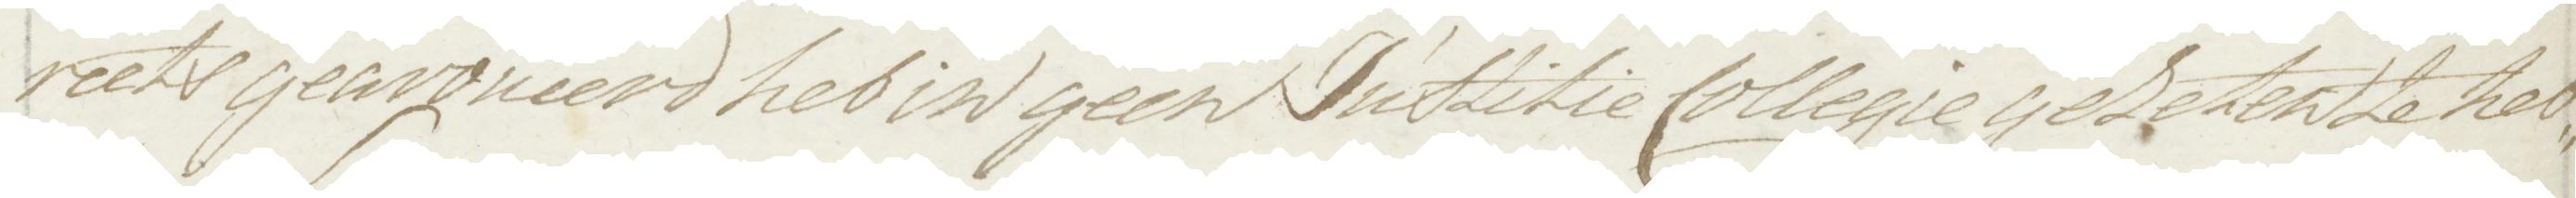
reets geavoueerd heb in geen Iustitie Collegie gezeten te heb„
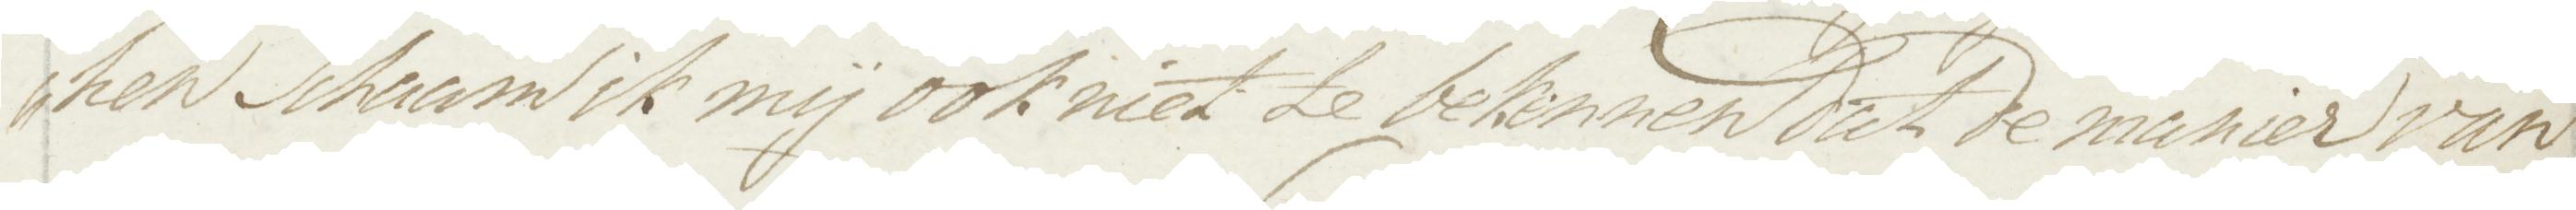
„ben Schaam ik mij ook niet te bekennen dat de manier van
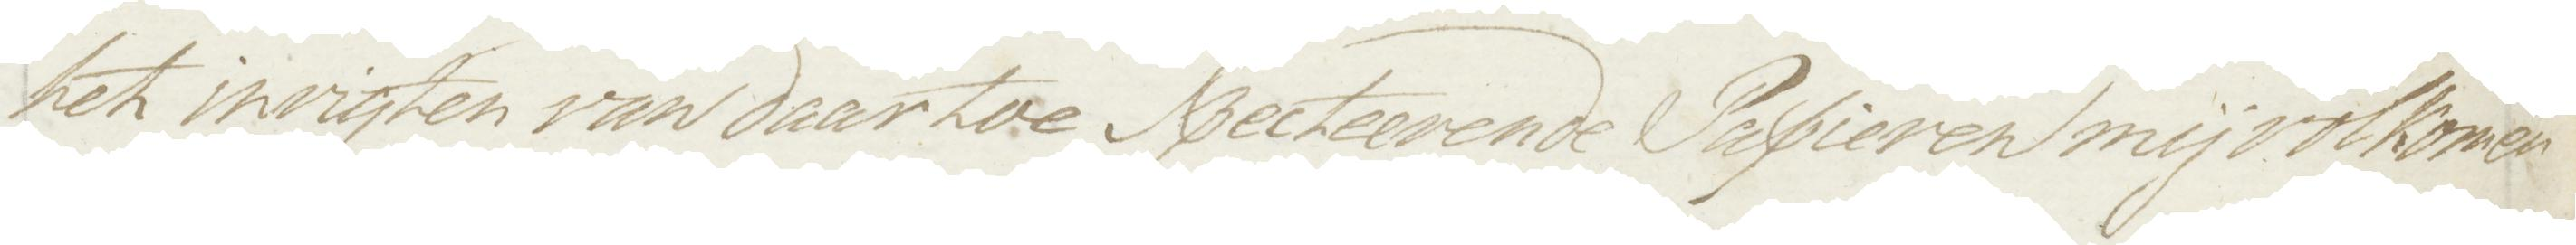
het inrigten van daar toe Specteerende Papieren mij volkomen
